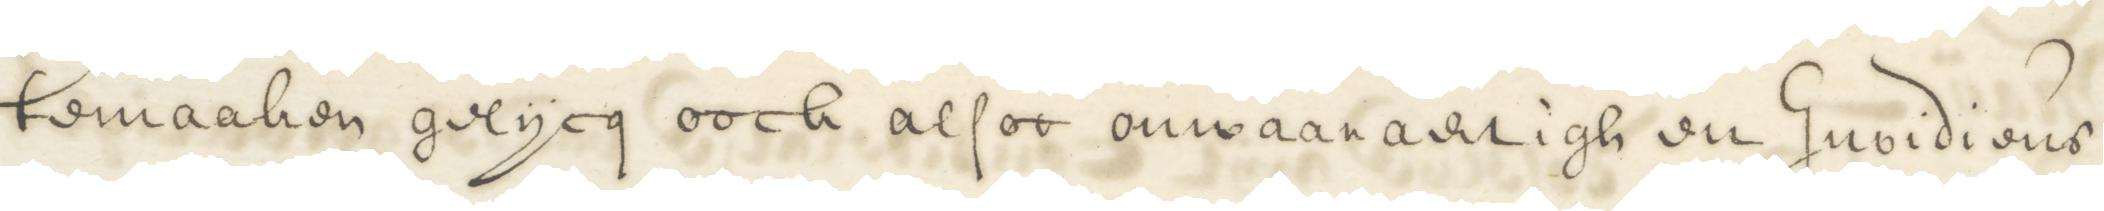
temaaken gelijcq oock alsoo onwaaraetigh en Jnvidieus
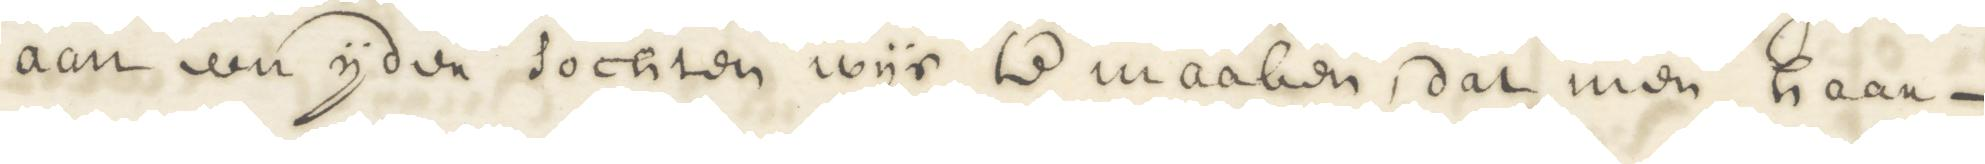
aan een ijder sochten wijs te maaken, dat men haar –
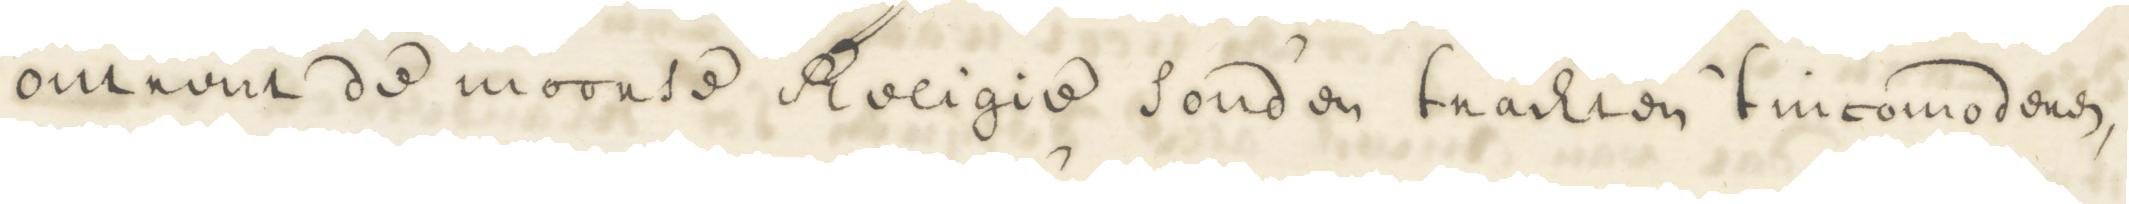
ontrent de moorse Religie souden trachten ’t incomoderen,
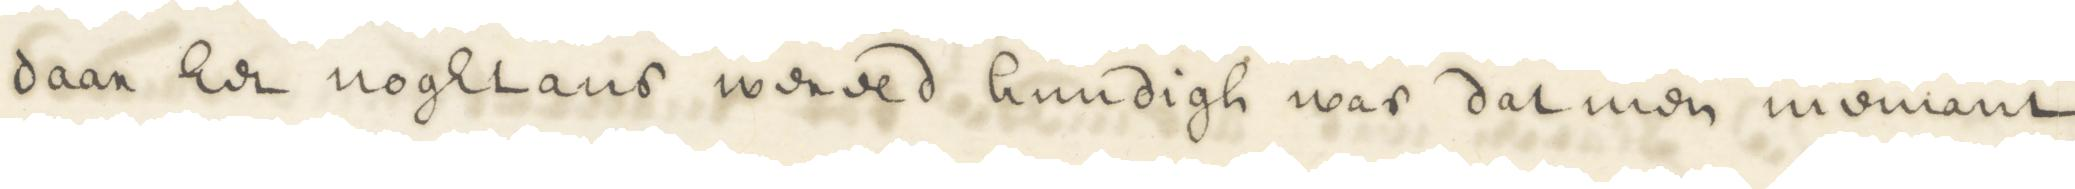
daar het noghtans wereld kundigh was dat men niemant
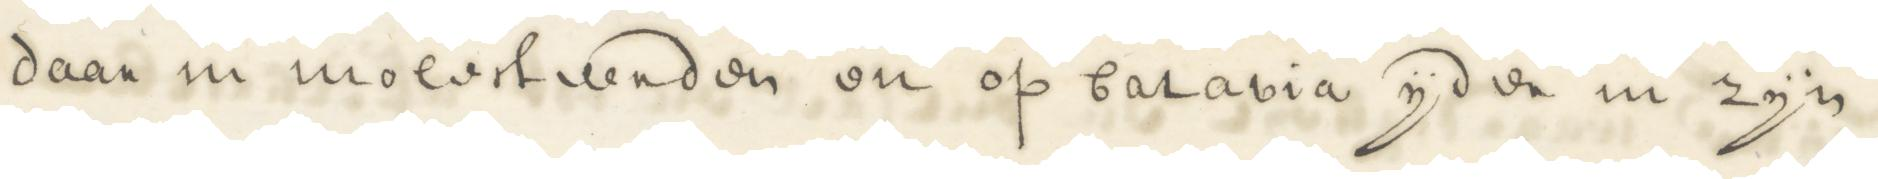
daar in molesteerden en op batavia ijder in zijn
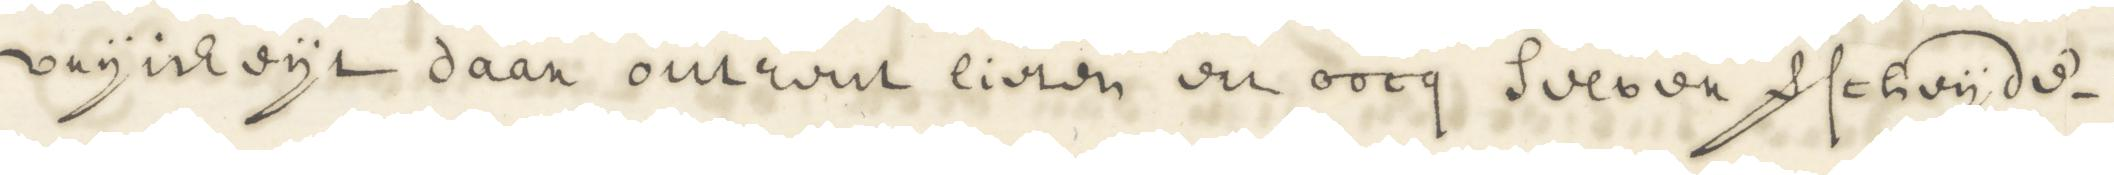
vrijicheijt daar ontrent lieten en oocq selver verscheijde-
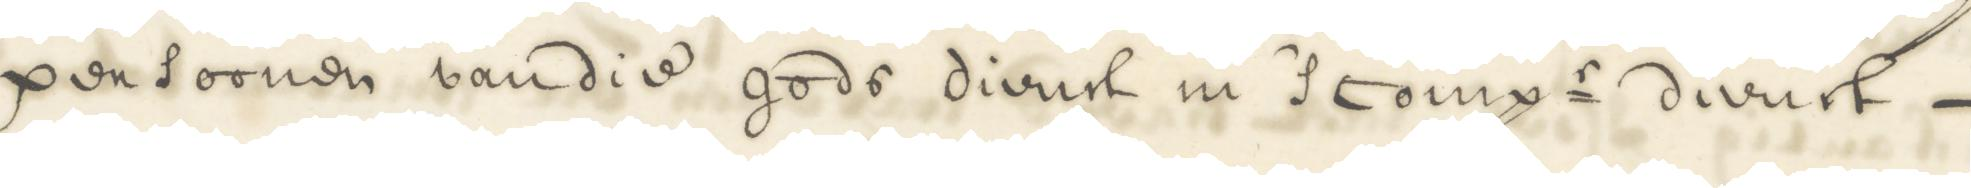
persoonen van die gods dienst in ’s comp=s dienst –
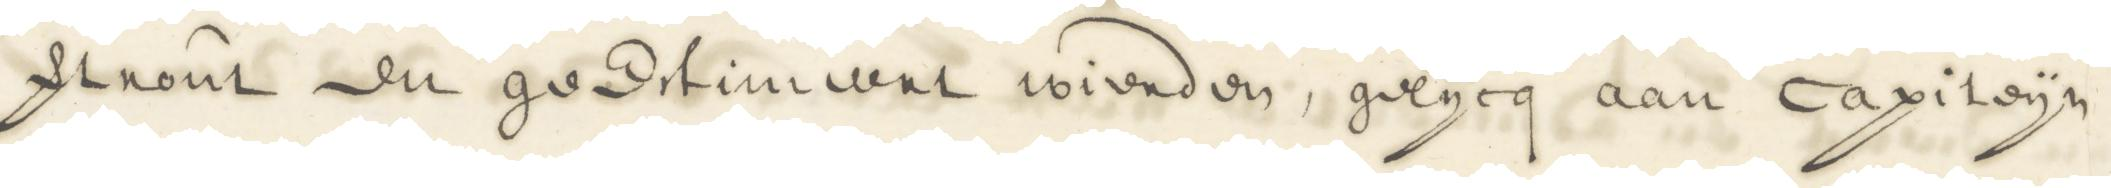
vertrout en gedetimeert wierden, gelijcq aan capiteijn
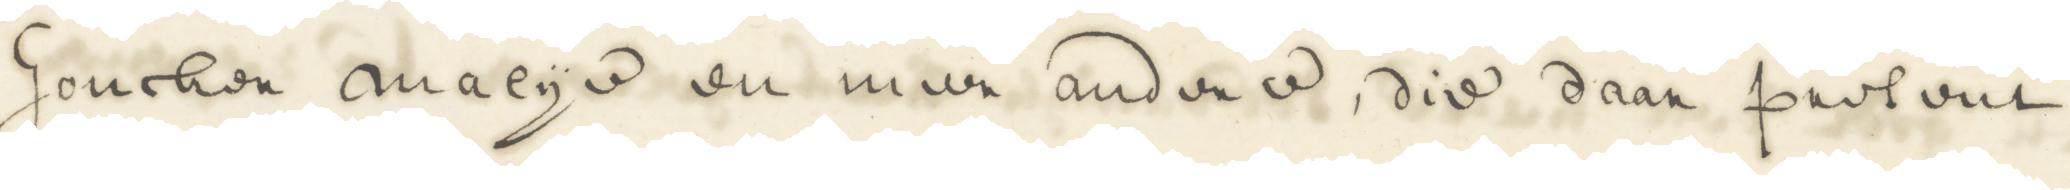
Joncker malije en meer andere, die daar present
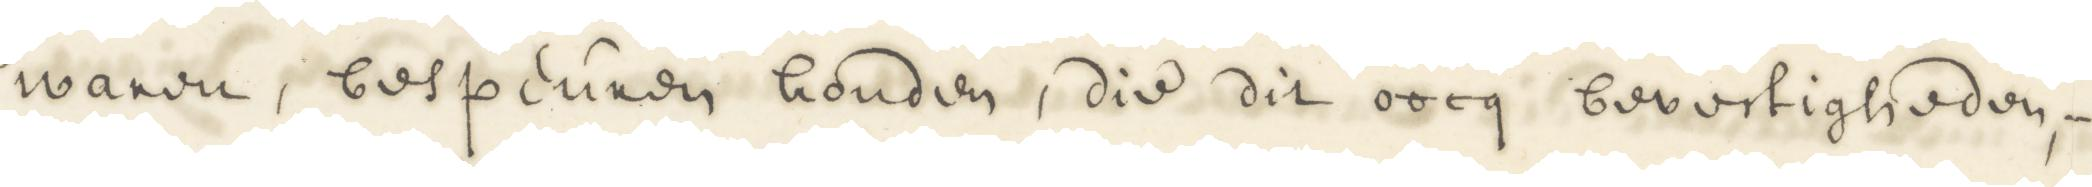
waren, bespeuren konden, die dit oocq bevestigheden,-
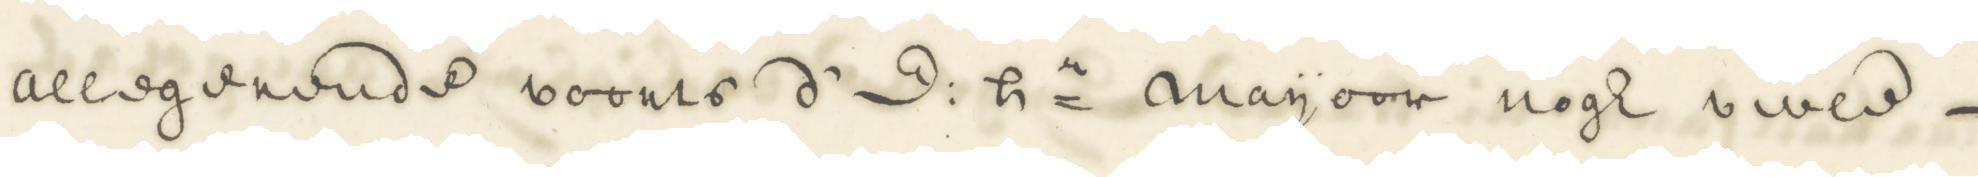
allegerende voorts d’ E: H=r maijoor nogh vele –
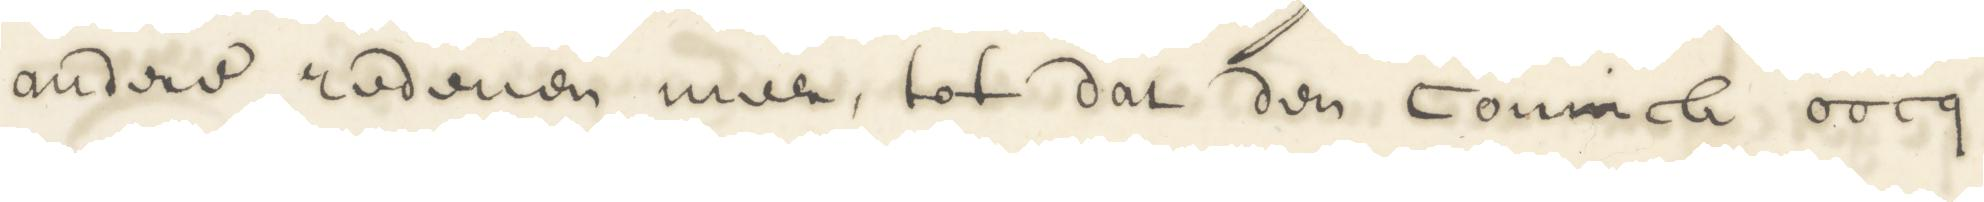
andere redenen mee, tot dat den Coninck oocq
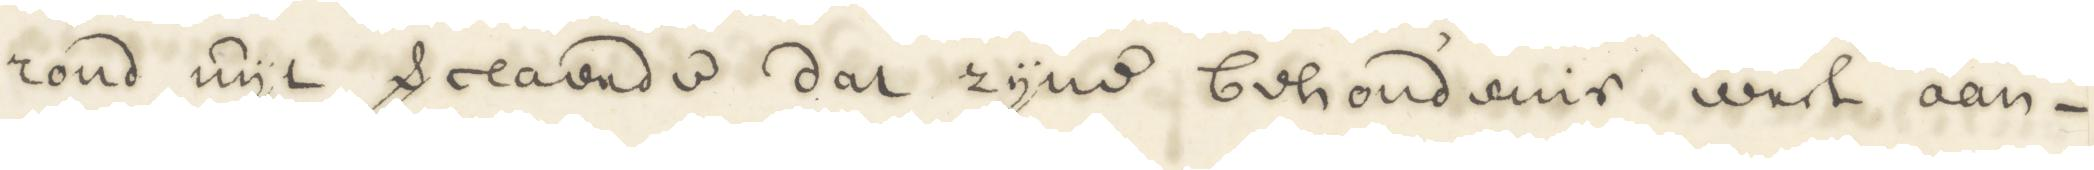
rond uijt verclaerde dat zijne behoudenis eerst aan –
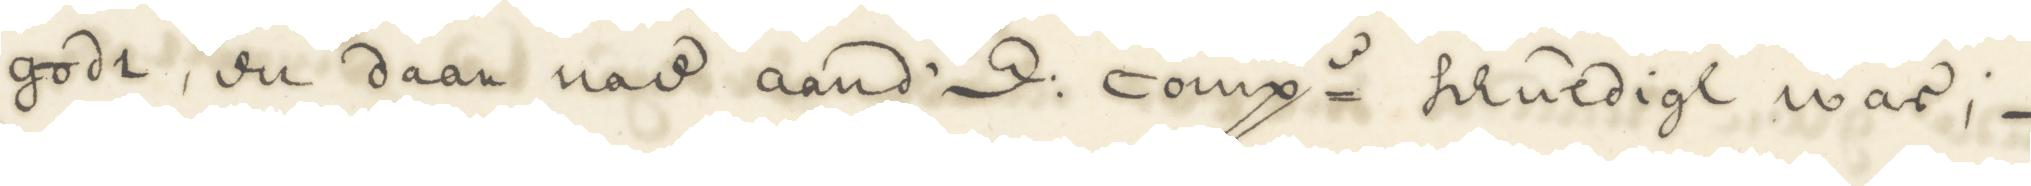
godt, en daar nae aand' E: Comp=e schuldigh was; –
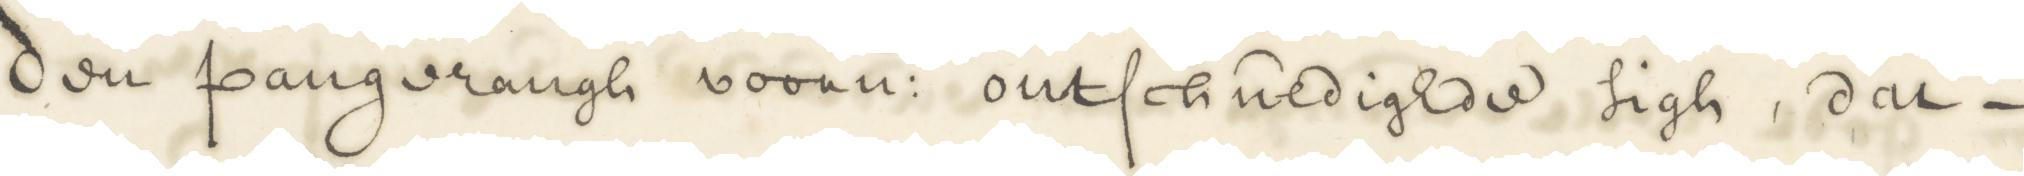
den pangerangh voorn: ontschuldighde sigh, dat –
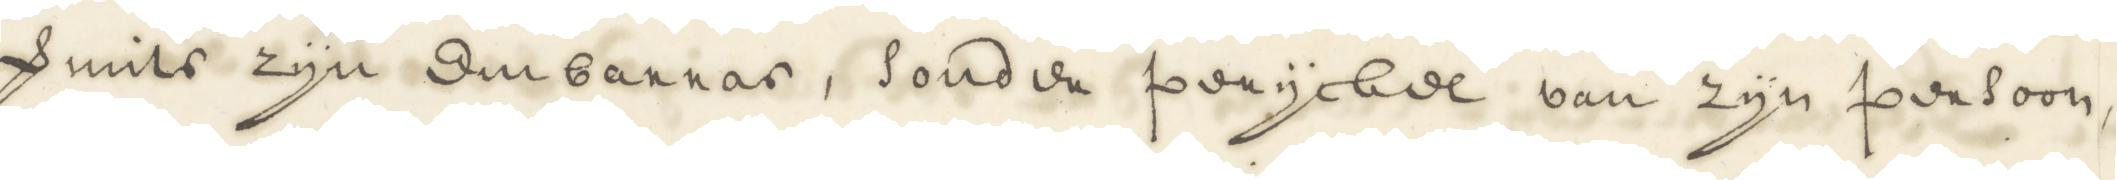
vermits zijn Embarras, sonder perijckel van zijn persoon,
